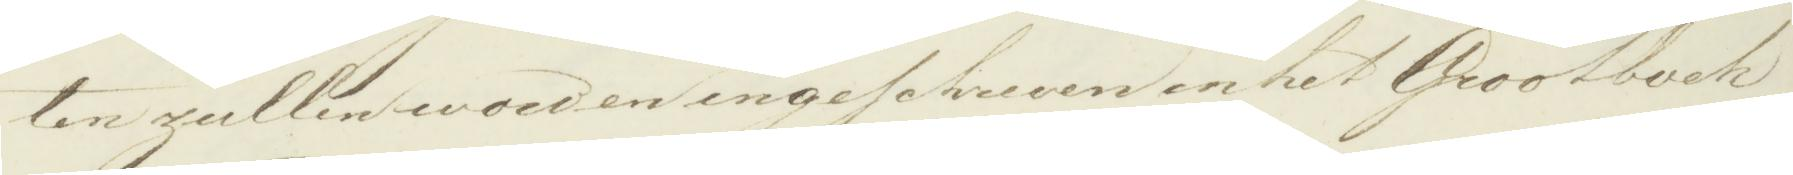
ten zullen worden ingeschreven in het Grootboek
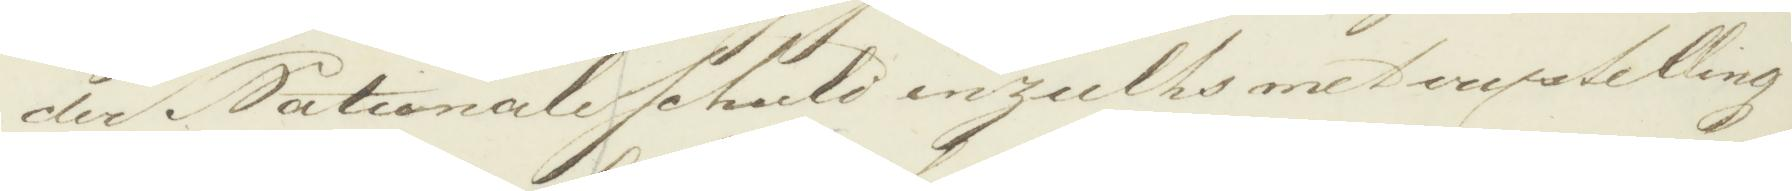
der Nationale schuld en zulks met vrystelling
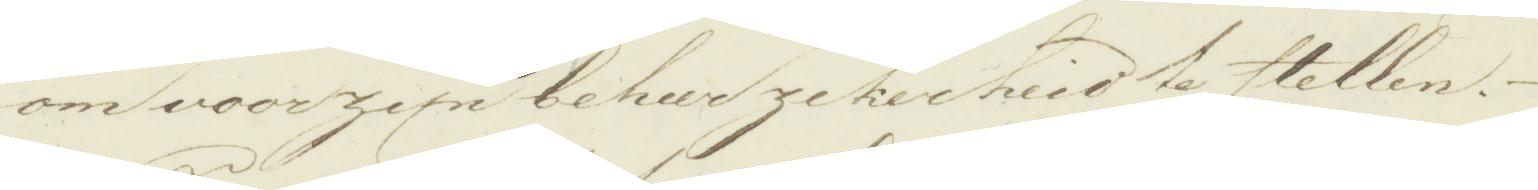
om voor zyn beheer zekerheid te stellen.-
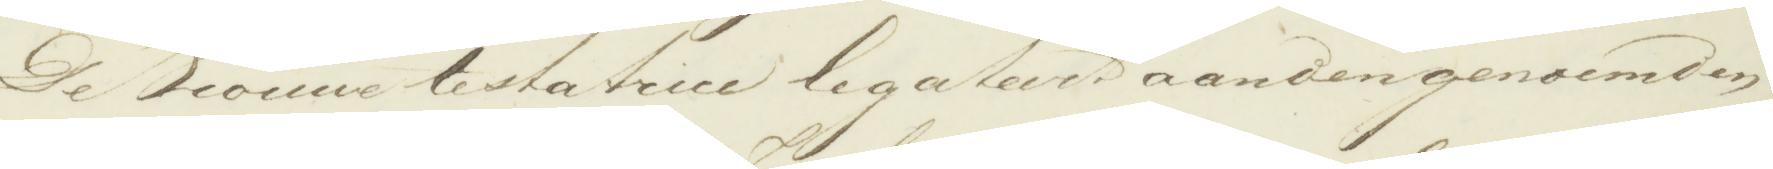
De Vrouwe testatrice legateert aan den genoemden
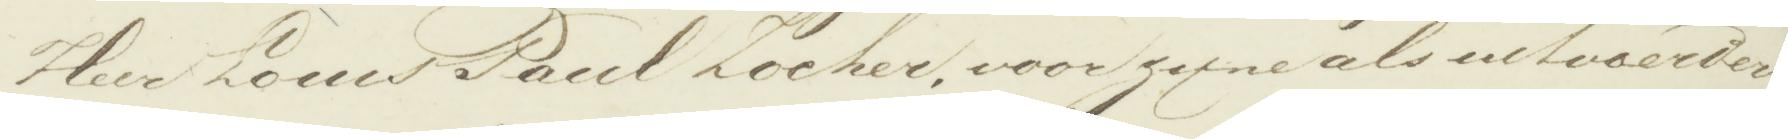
Heer Louis Paul Zocher, voor zyne als uitvoerder
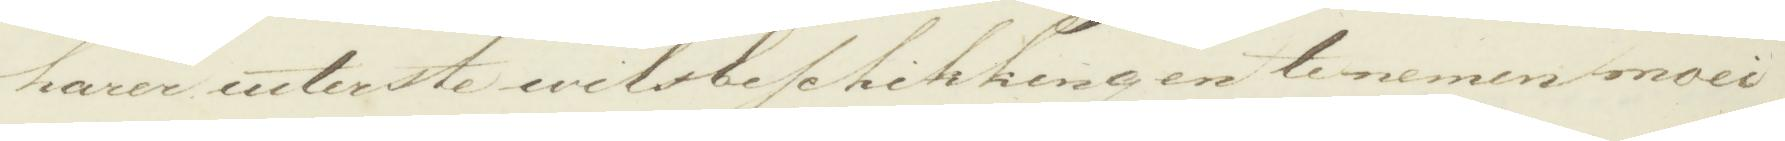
harer uiterste wilsbeschikking en te nemen moei
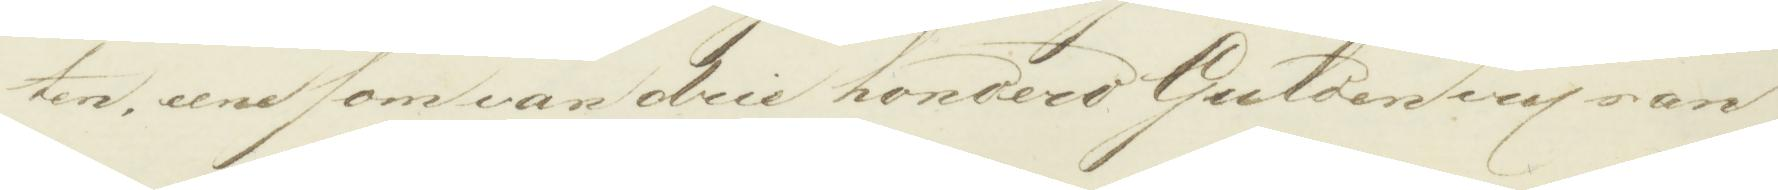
ten, eene som van drie honderd Gulden vry van
